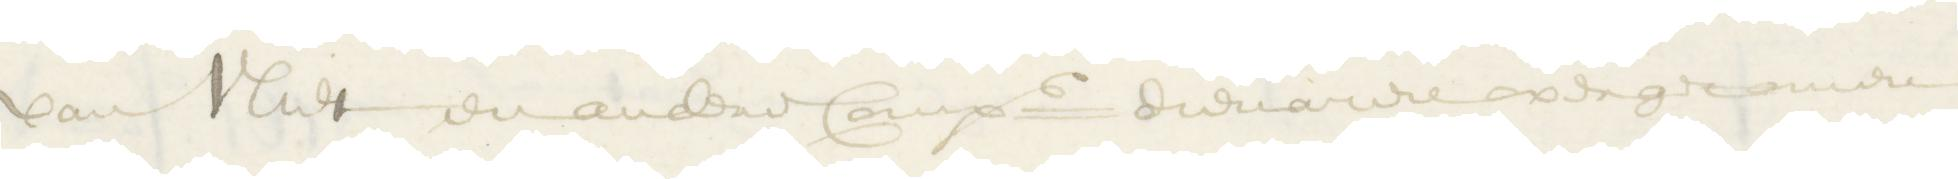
van Vliet en andere Comp=s dienaren overgecomen
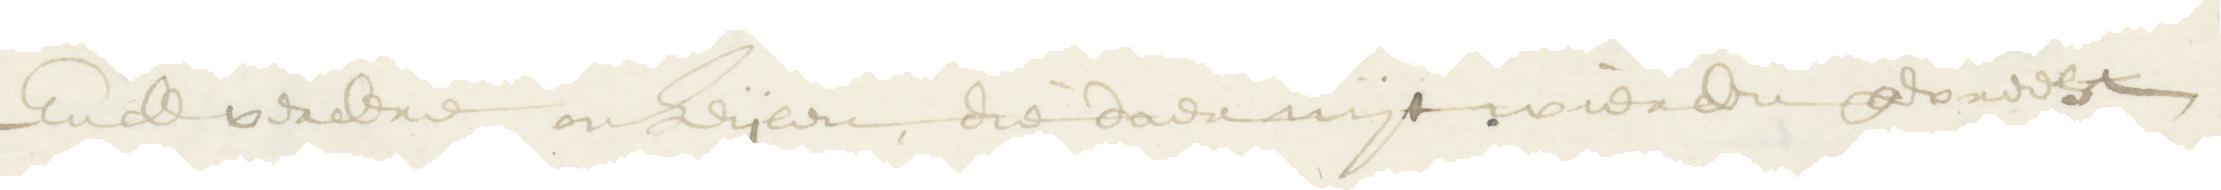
Ende verdere onheijlen, die daer uijt wierden gevreest
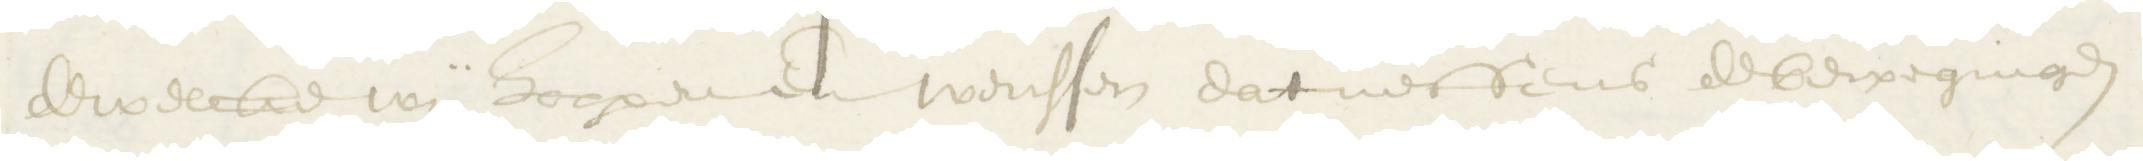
dewelcke wij hoopen En wenssen dat neffens de bewegingen
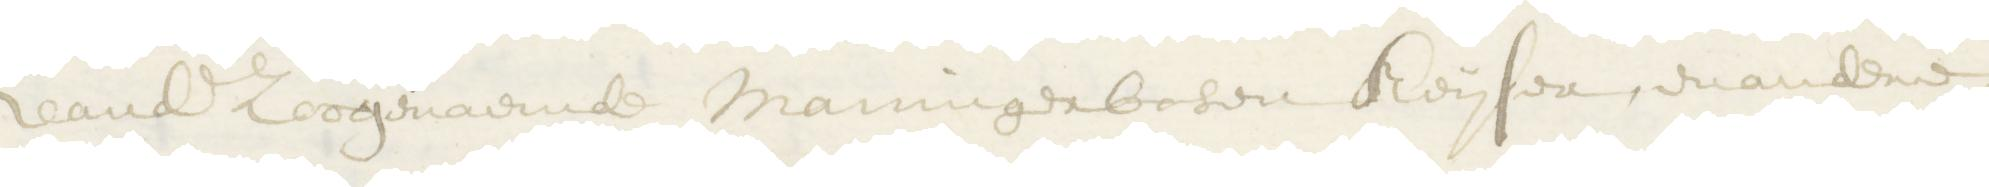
vande zoogenaemde maningerbosen keijser, en andere
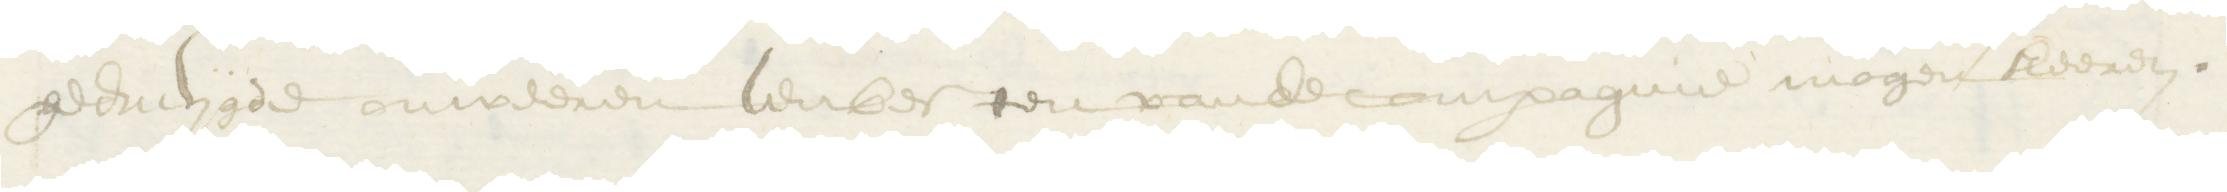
gedreijgde onweeren ten besten van de compagnie mogen keeren.
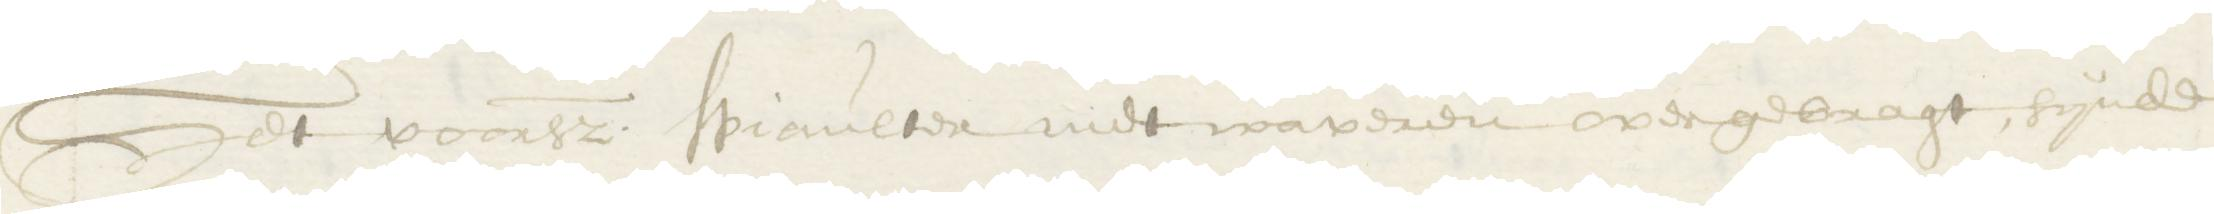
Het voorsz: spiaulter niet waveren overgebragt, sijnde
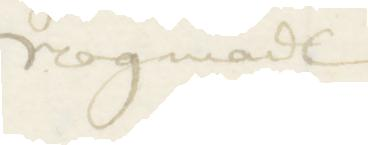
Nogmael
